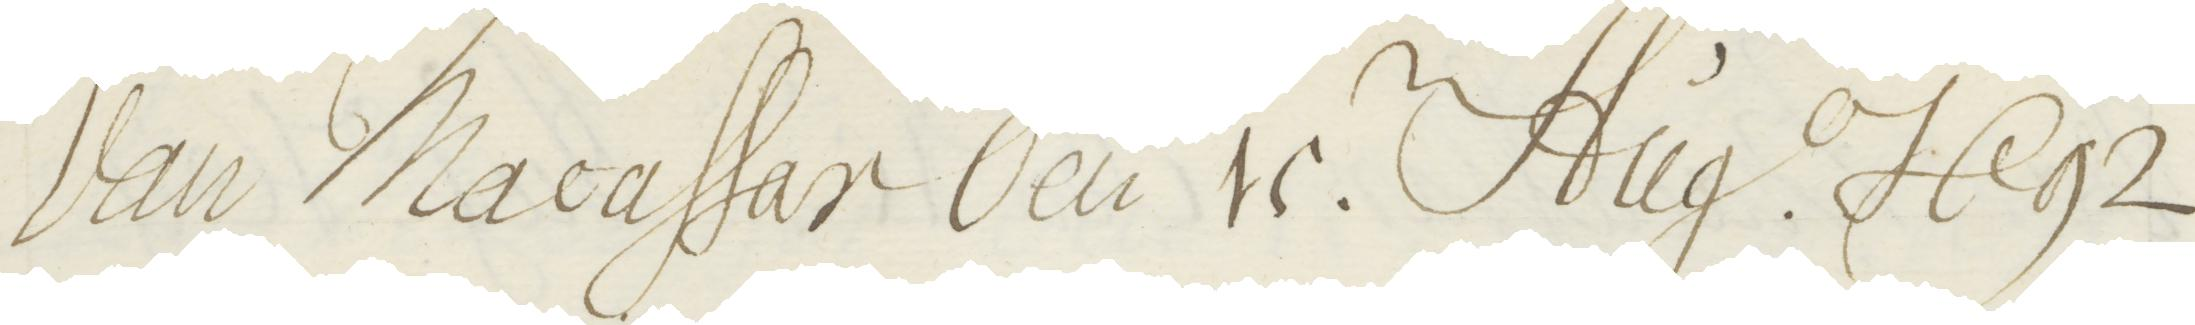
Van Macassar den 15. Aug:o 1692
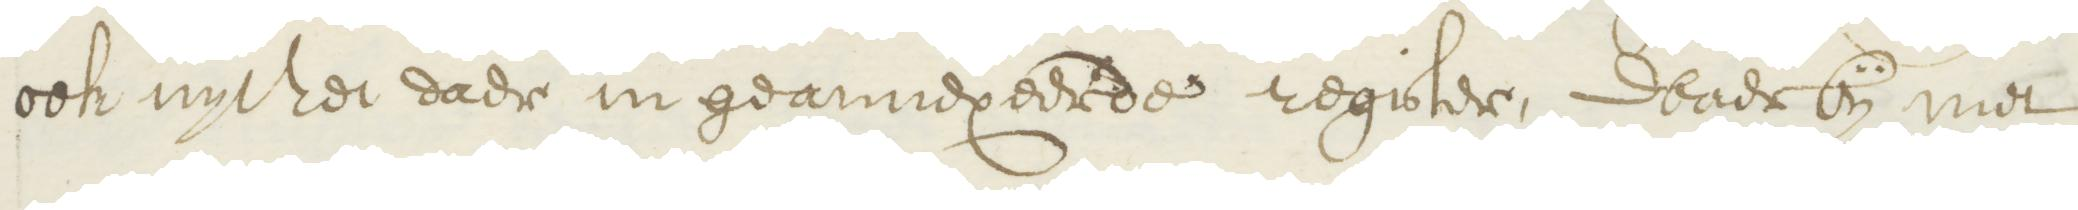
ook uijt het daer in geannexeerde register, waerbij met
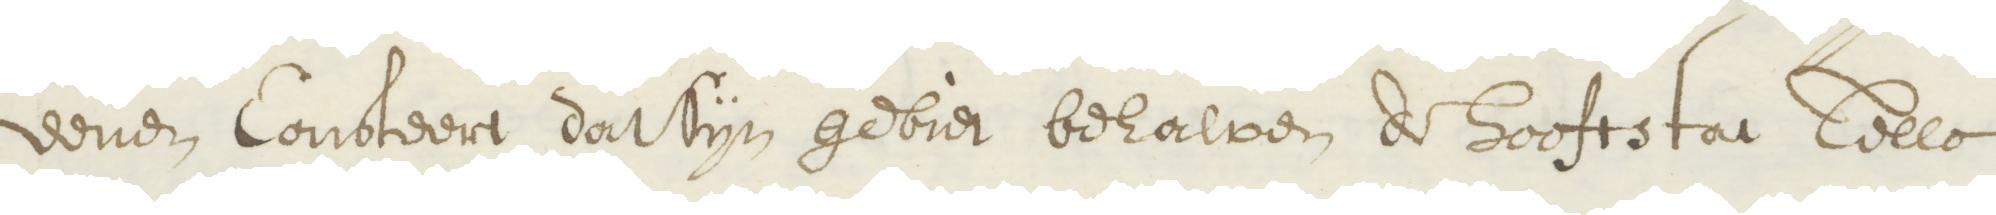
eenen Consteert dat Sijn gebiet behalven de hooftstat Tello
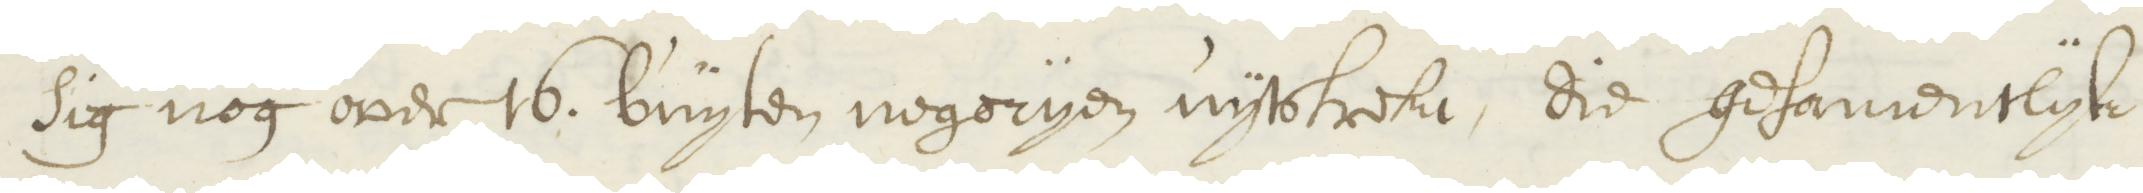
Sig nog over 16. buijten negorijen uijtstrekt, die gesamentlijk
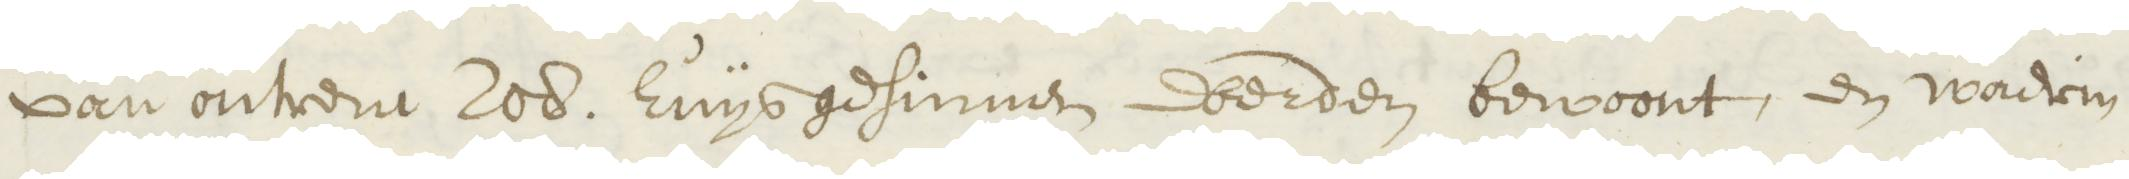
van ontrent 208. huijs gesinnen werden bewoont, en waerin
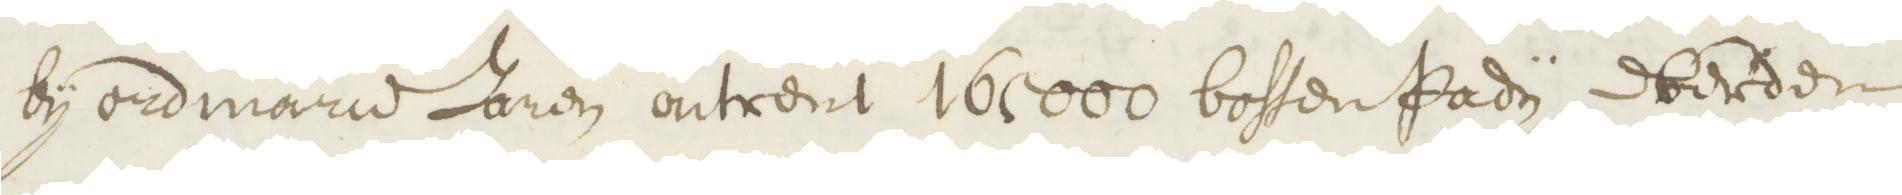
bij ordinarie Iaren ontrent 165000 bossen padij werden
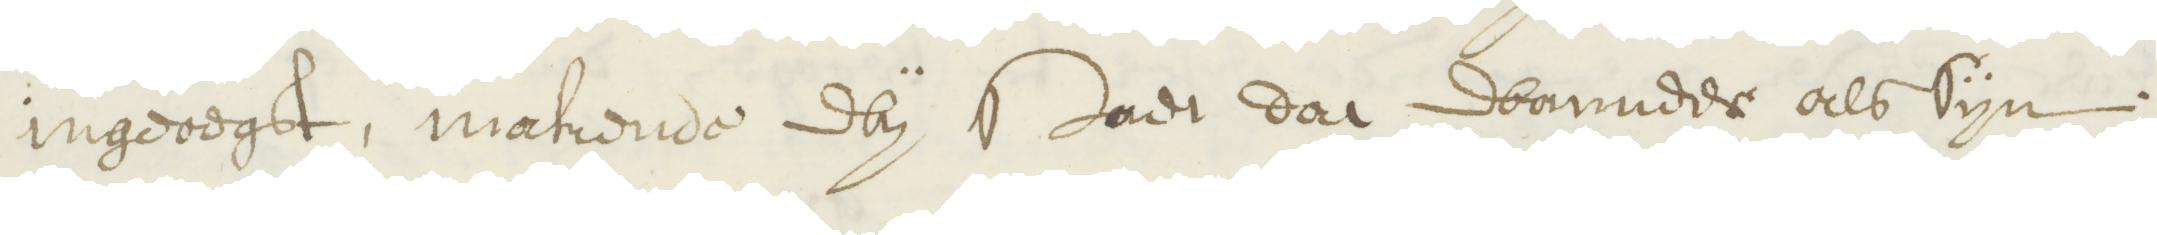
ingeoegst, makende wij t Iaer dat wanneer als sijn
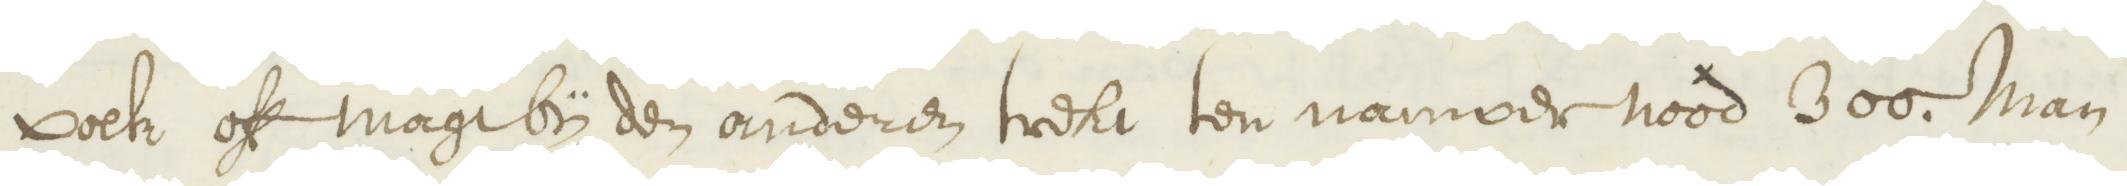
volk of magt bij den anderen trekt ten nauwer nood 300. Man
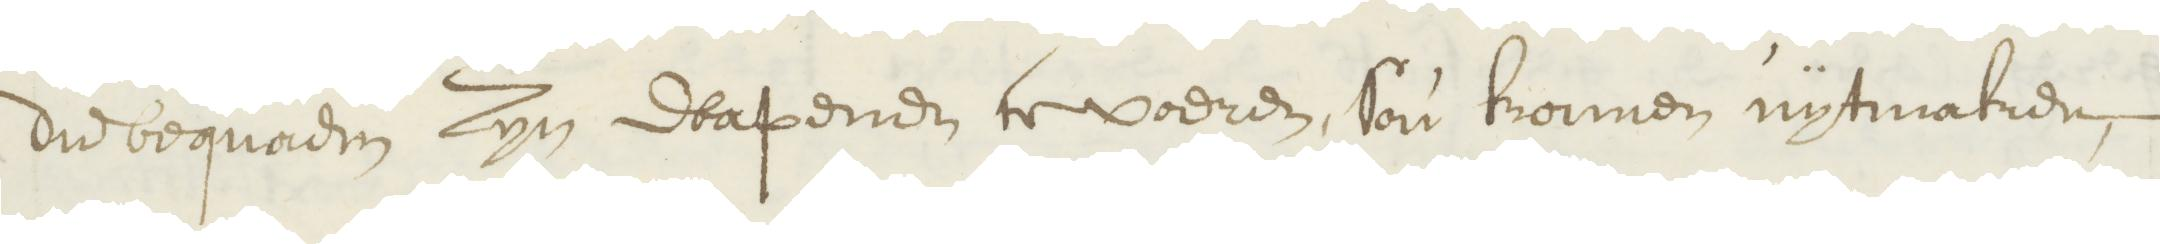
die bequaem Zijn wapenen te voeren, Sou konnen uijtmaken,
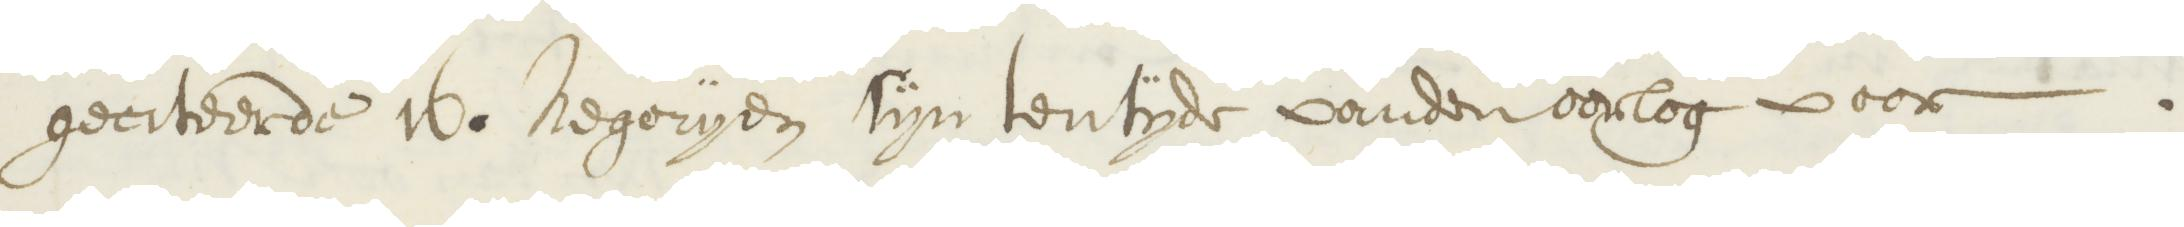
geciteerde 16. Negorijen Sijn ten tijde vanden oorlog voor
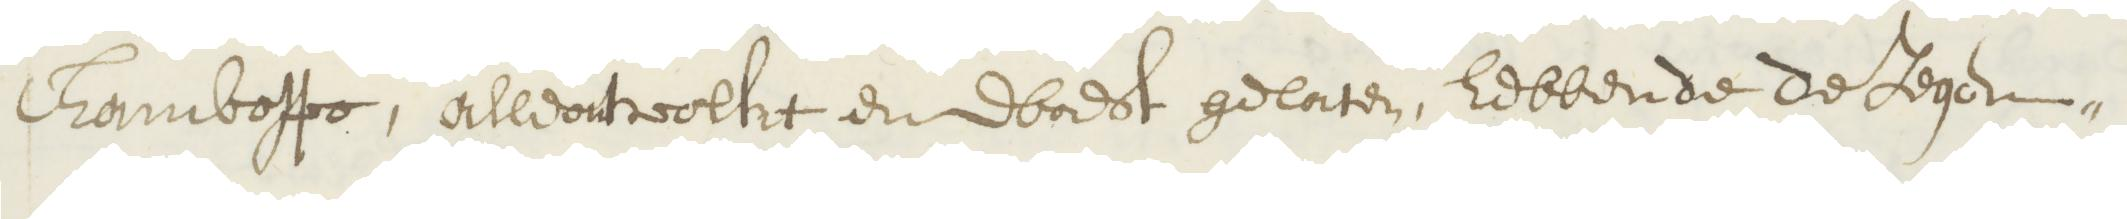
Tramboppo, alle ontvolkt en woest gelaten, hebbende de Iegen„
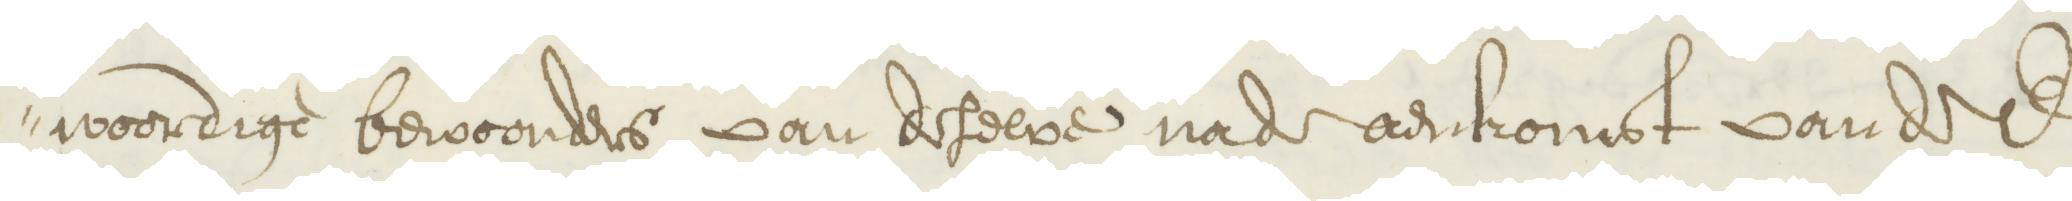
„woordige bewoonders van deselve nade aenkomst van de E
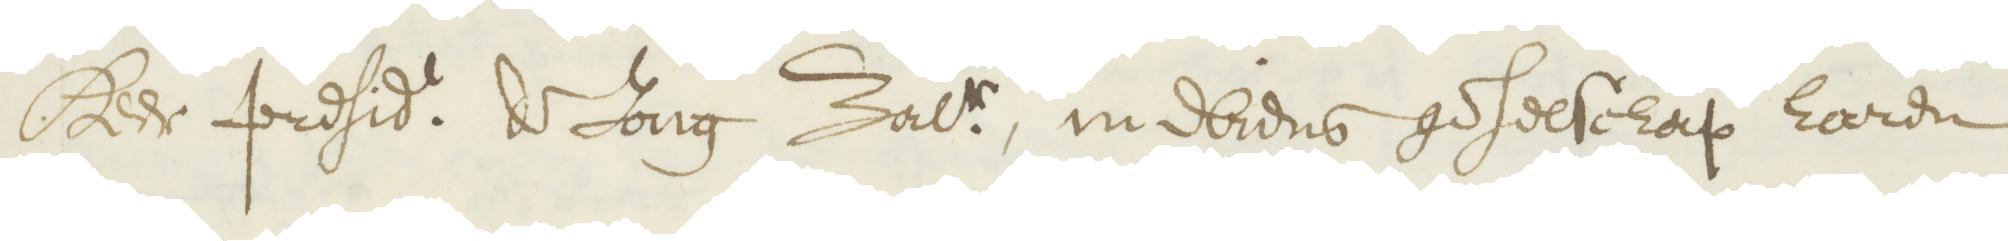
Heer presid.t de Iong Zal:r, in wiens geselschap haren
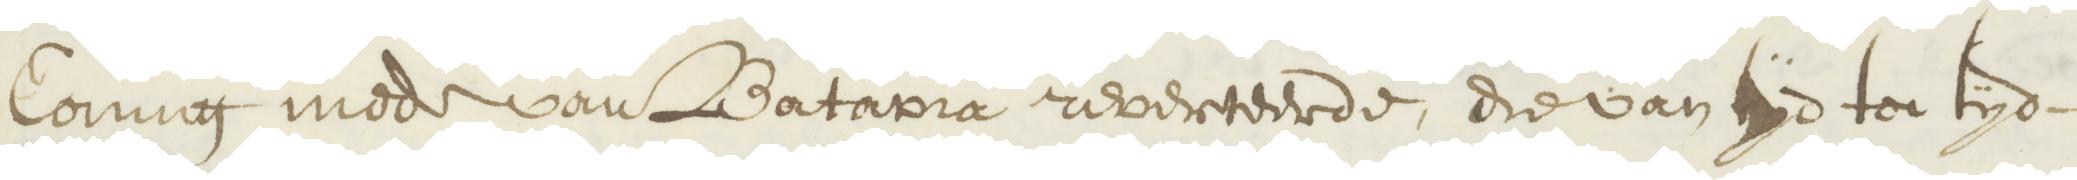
Coning mede van Batavia reverteerde, die van tijd tot tijd-
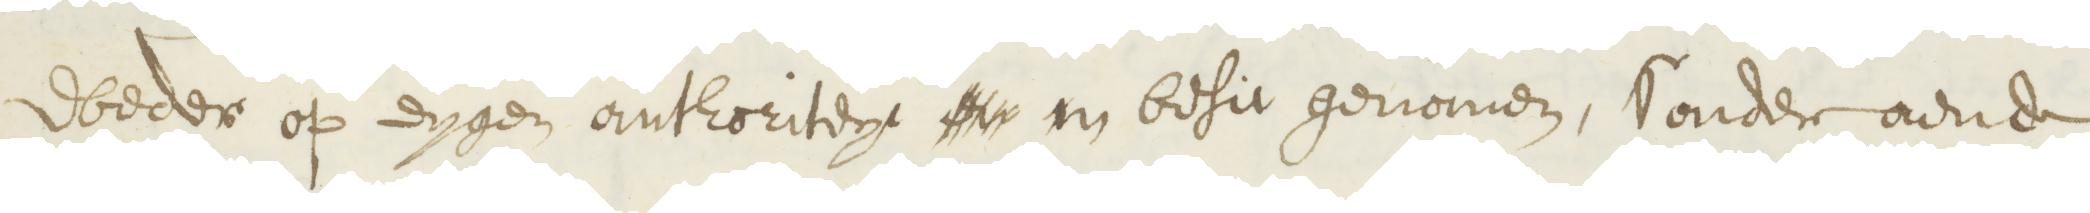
weder op eijgen authoriteijt en in besit genomen, Sonder aende
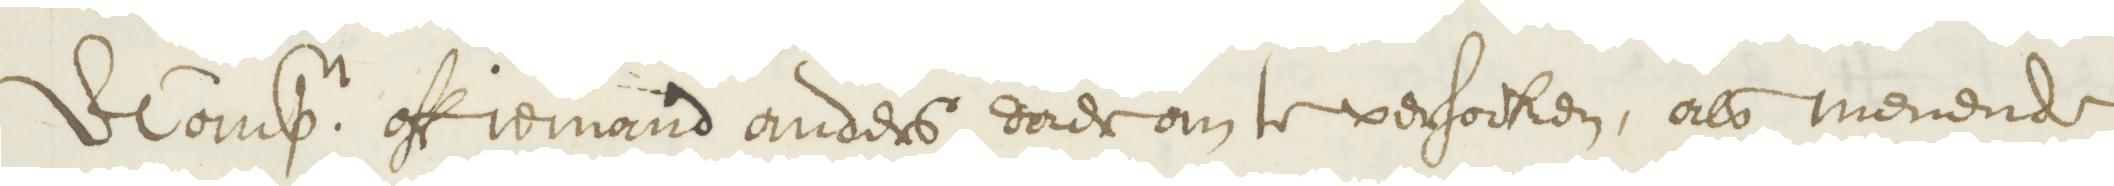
EComp:e off iemand anders daer om te versoeken, als menende
